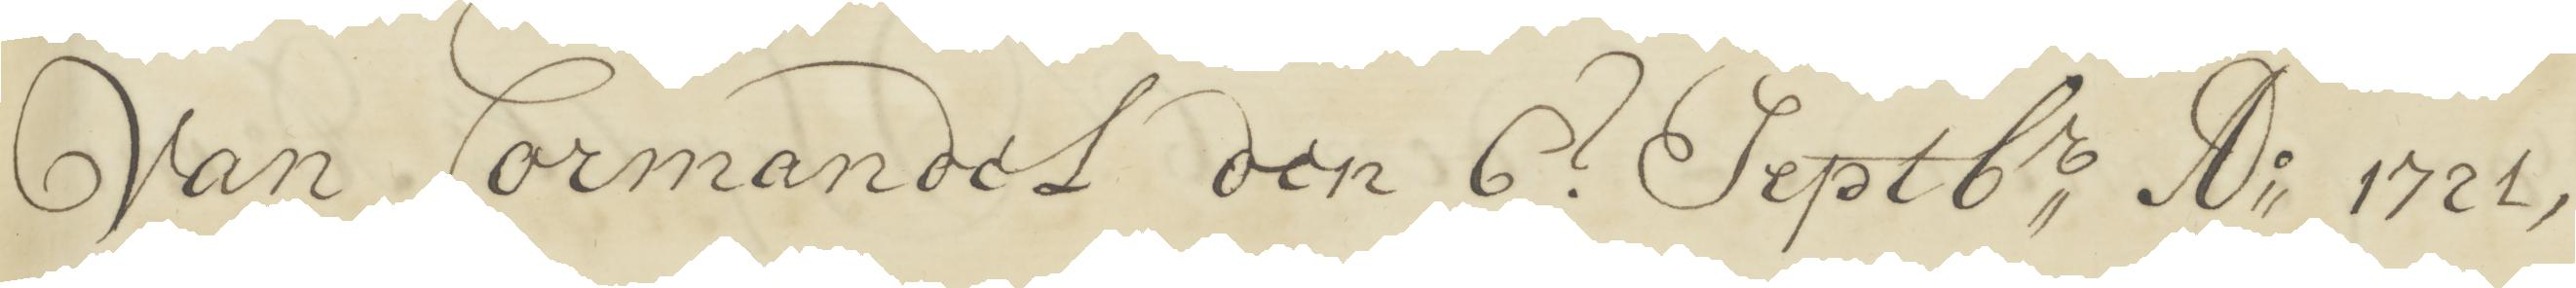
Van Cormandel den 6:' Septb„r A„o 1721,
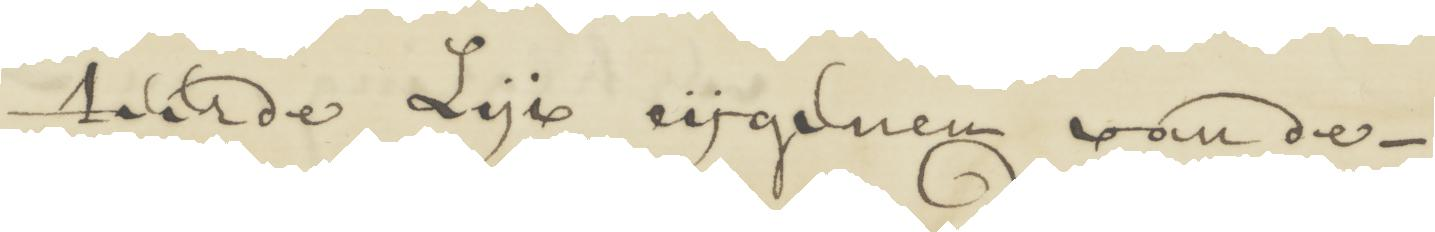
teerde Lijv eijgenen van de —
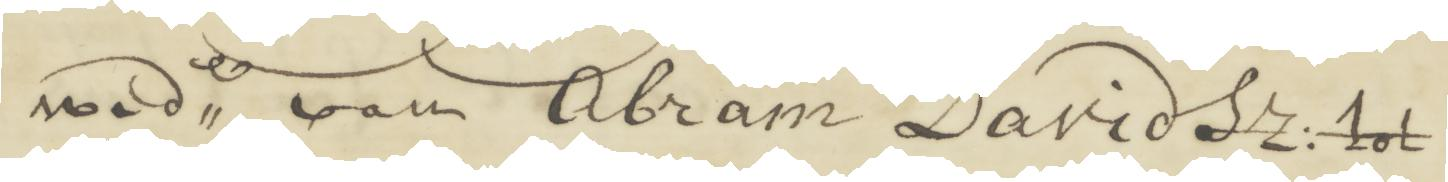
wed„e van Abram Davidsz: tot
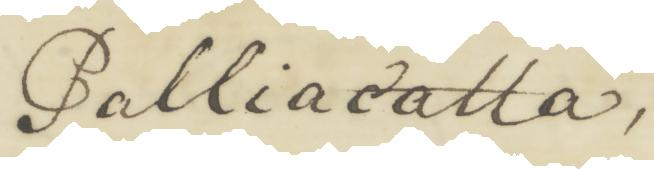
Palliacatta,
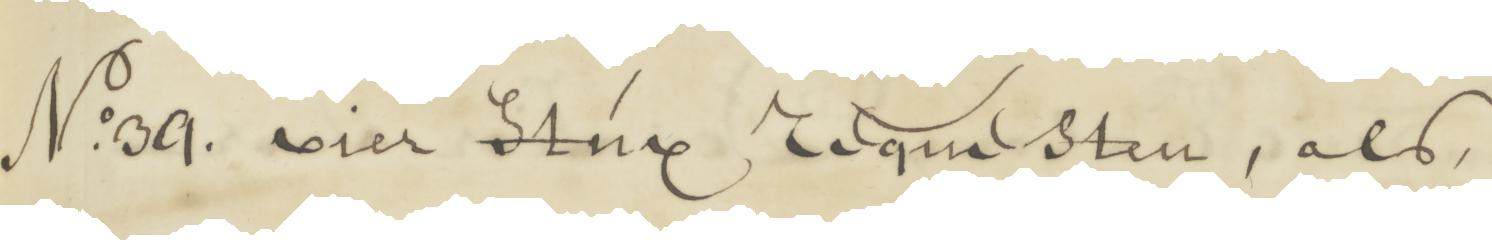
N:o 34. vier stux Requesten, als,
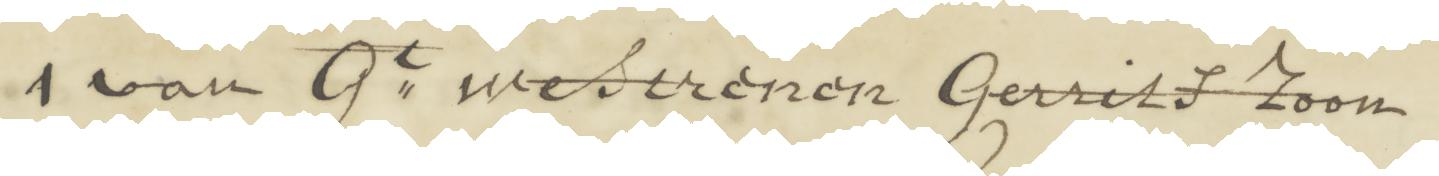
1 van g„t westrenen Gerrits zoon
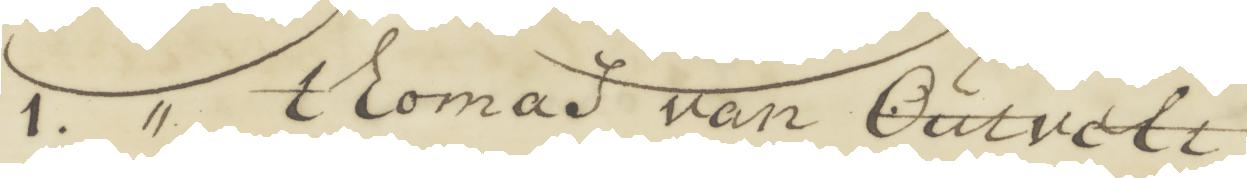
1. „ thomas van Outvelt
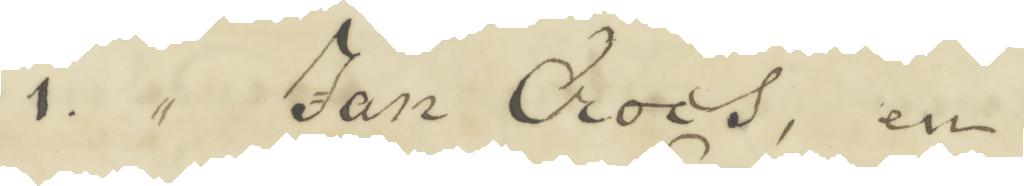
1. „ Ian Croes, en
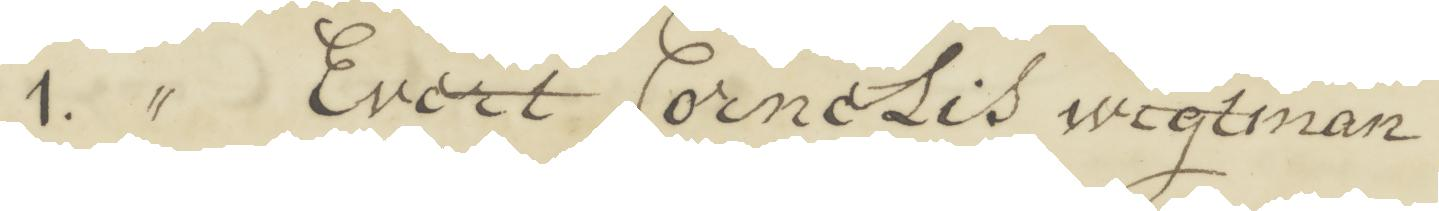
1. „ Evert Cornelis wigtman
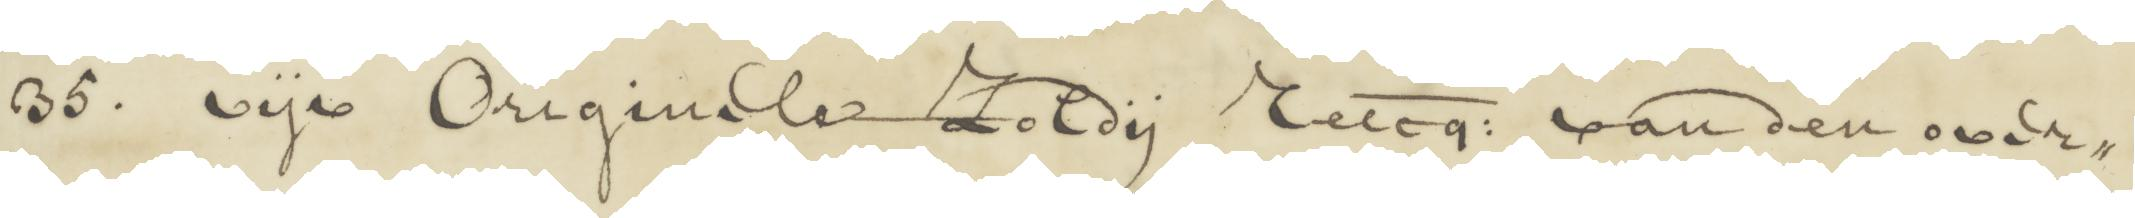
35. vijv Originele zoldij Reecq: van den over„
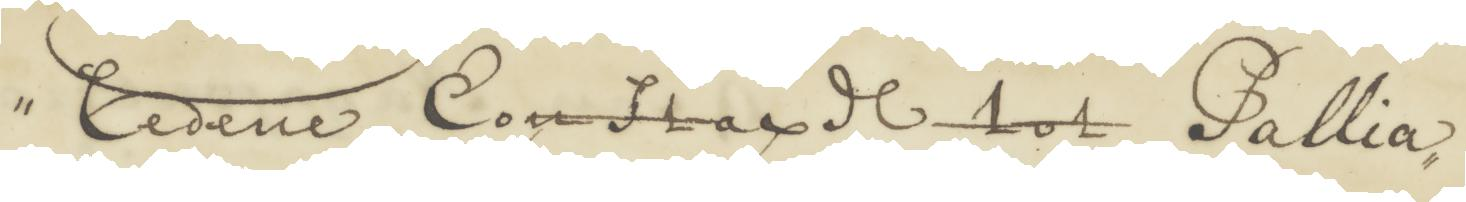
„ledene Constapel tot Pallia„
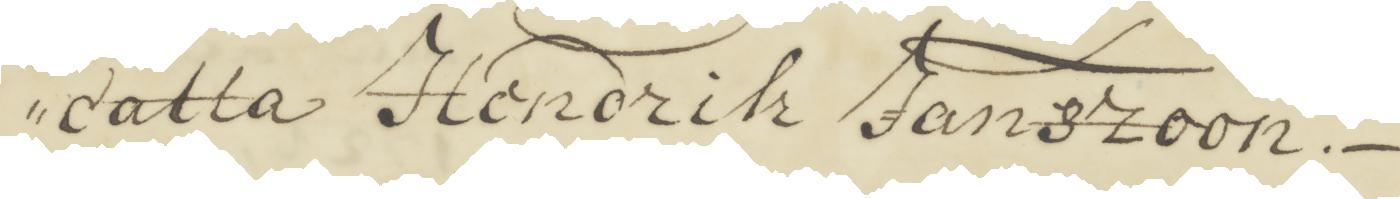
„catta Hendrik Ianszoon.—
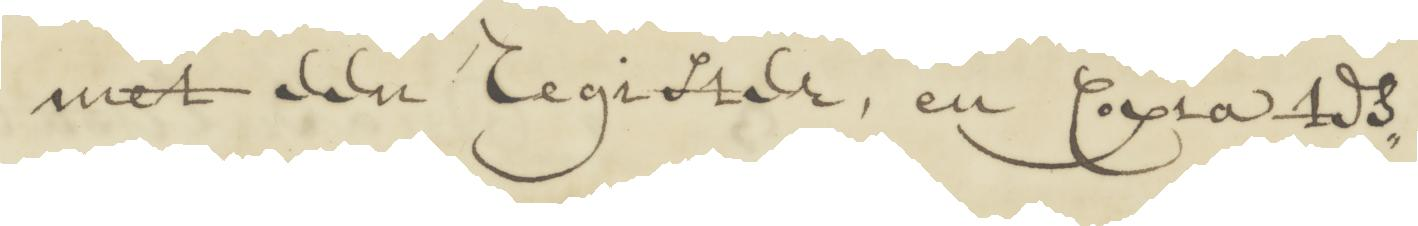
met een Register, en Copia tes„
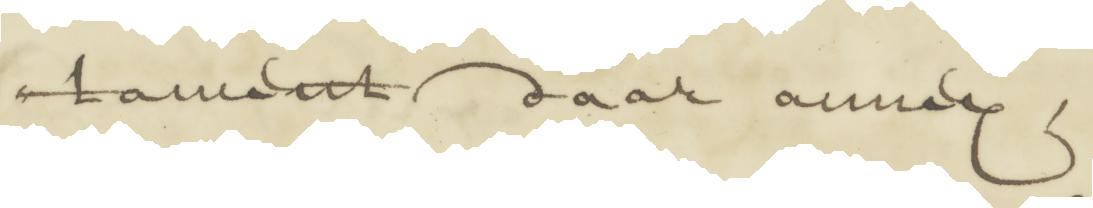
tament daar annex,
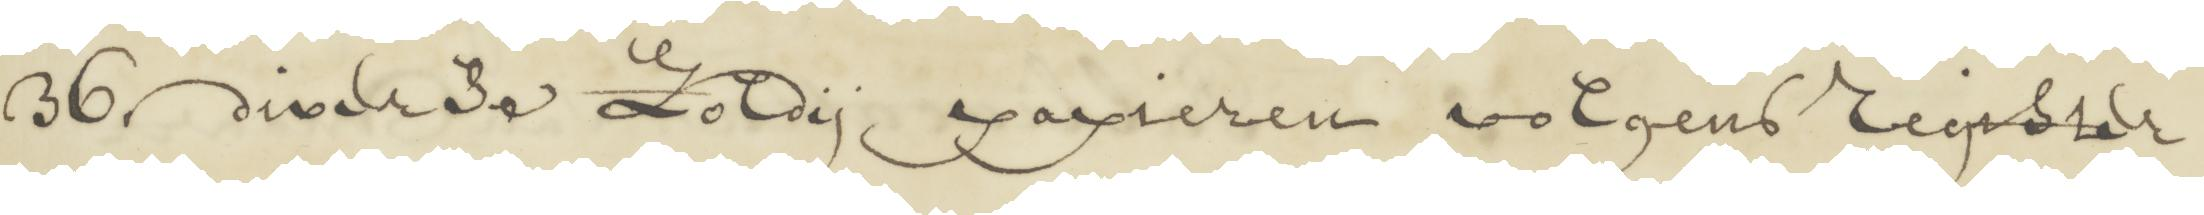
36. diverse zoldij papieren volgens Register
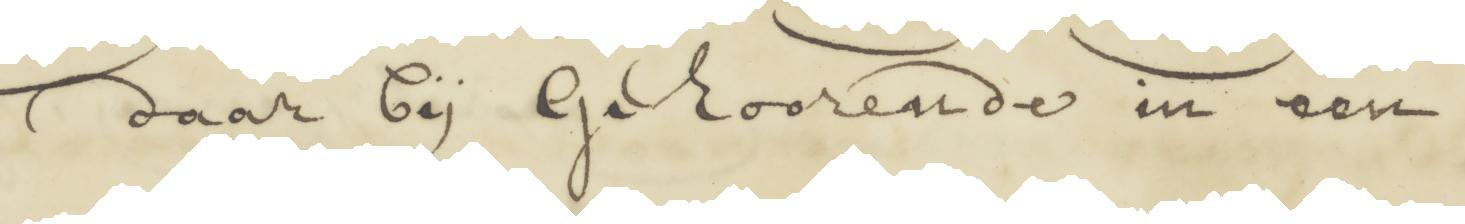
daar bij Gehoorende in een
